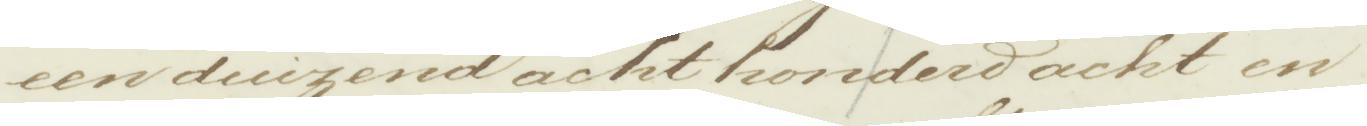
een duizend acht honderd acht en
